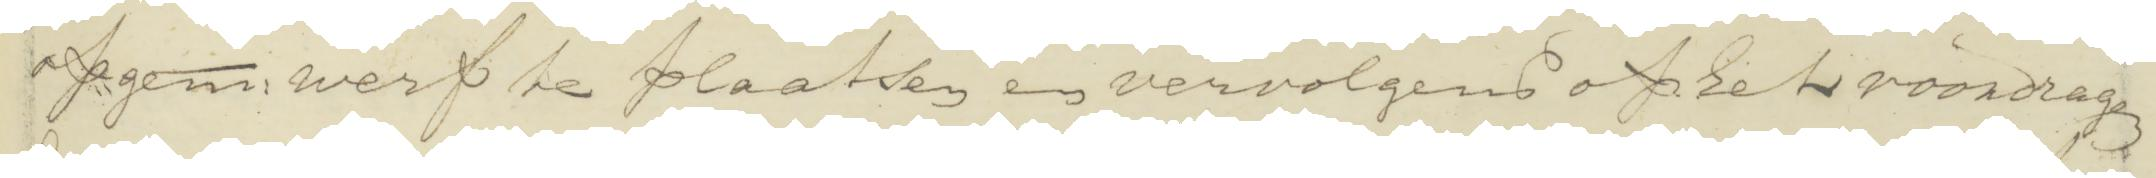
op gem: werf te plaatsen en vervolgens op het voordragen
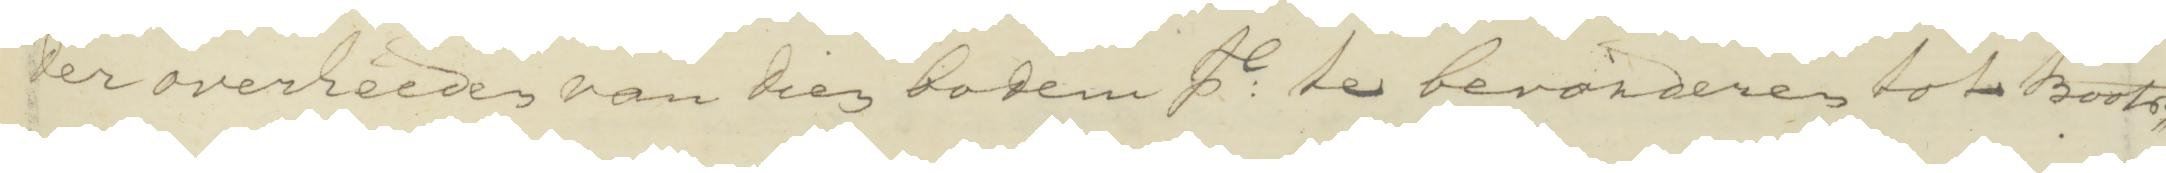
der overheeden van dien bodem p:l te bevorderen tot Boot„
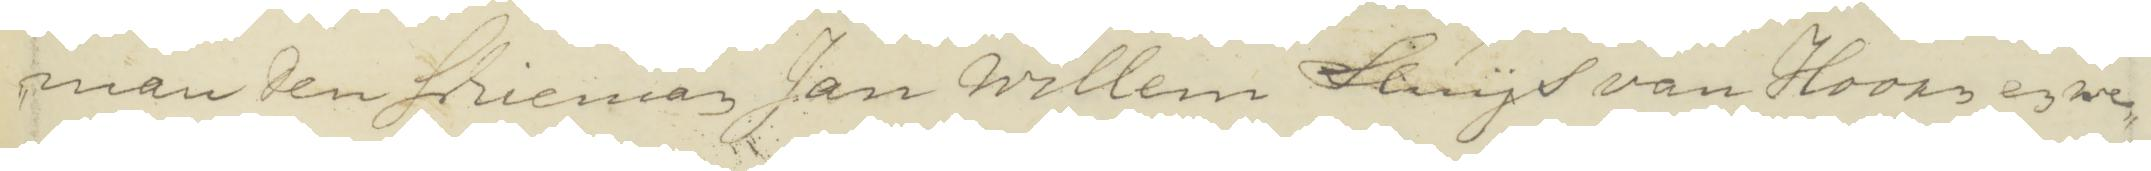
„man den Schieman Jan Willem Sluijs van Hoorn en we„
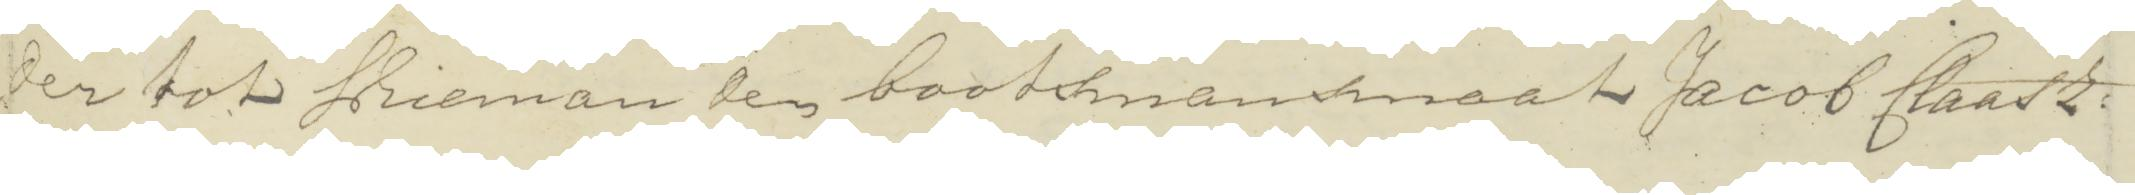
„der tot Schieman den bootsmansmaat Jacob Claasz:
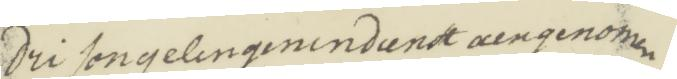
dri Jongelingen in dienst aengenomen
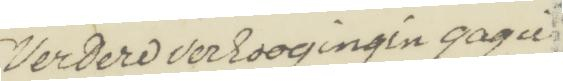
verdere verhooging in gagie
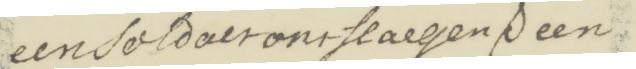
een soldaet ontslaegen & een
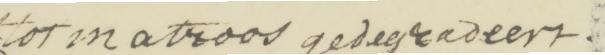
tot matroos gedegradeert.
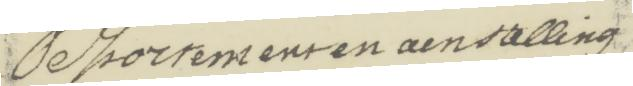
Deportement en aenstelling
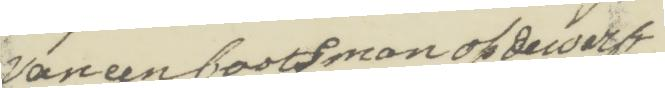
van een bootsman op de werf
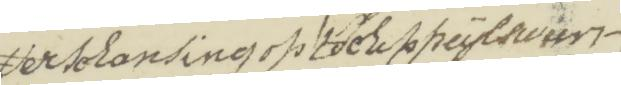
verschansing op 't schip peijlswiert.
